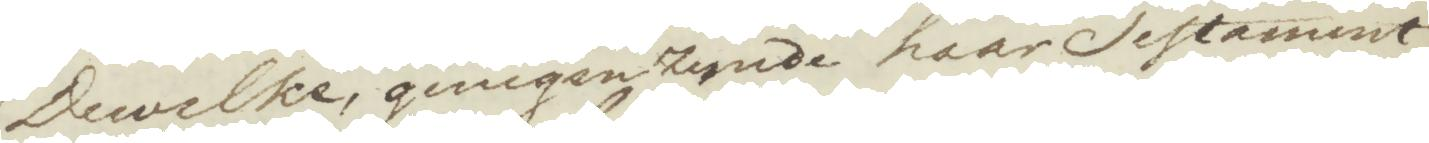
Dewelke, genegen zynde haar Testament
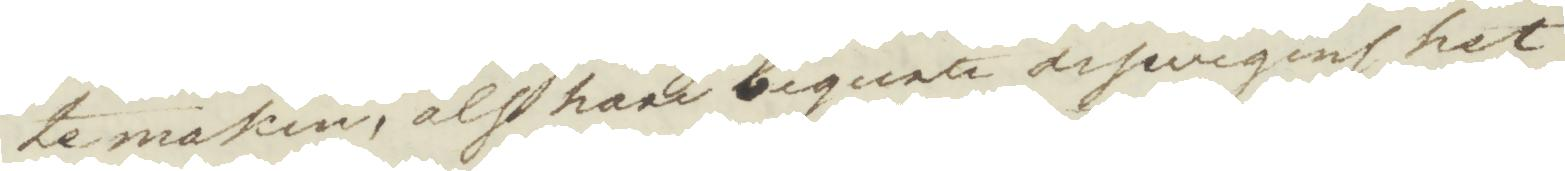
te maken, als hare begeerte deswegens het
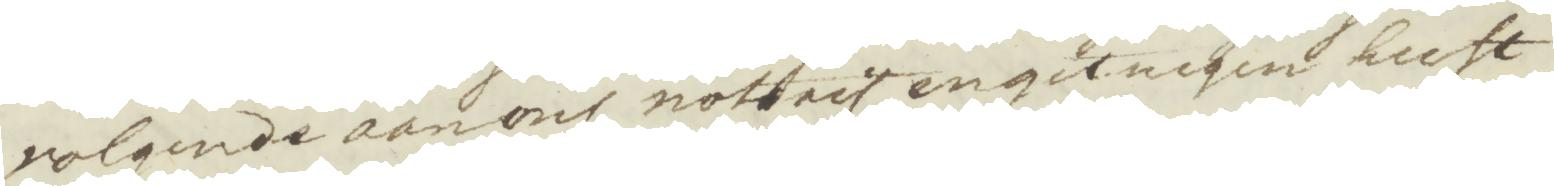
volgende aan ons notaris en getuigen heeft
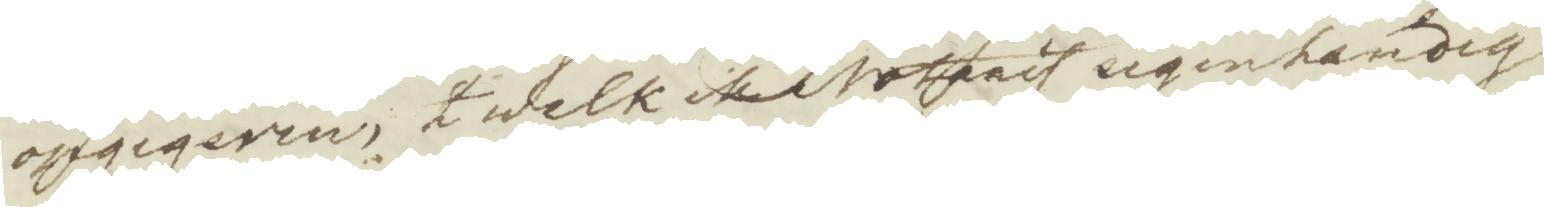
opgegeven, 't welk te Notaris eigenhandig
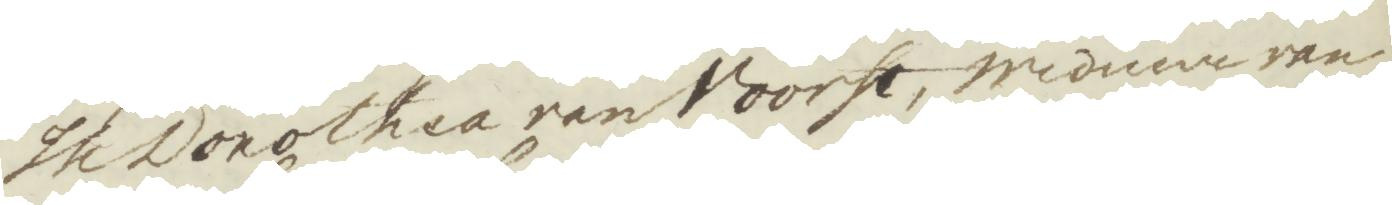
Ik Dorothea van Voorst, weduwe van
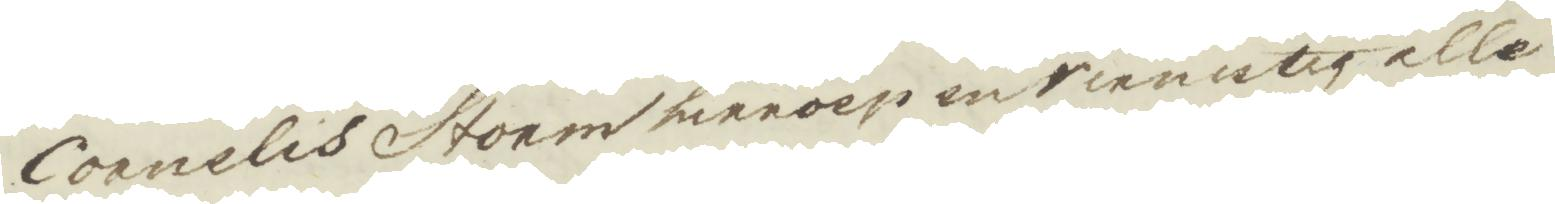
Cornelis Storm herroep en vernietig alle
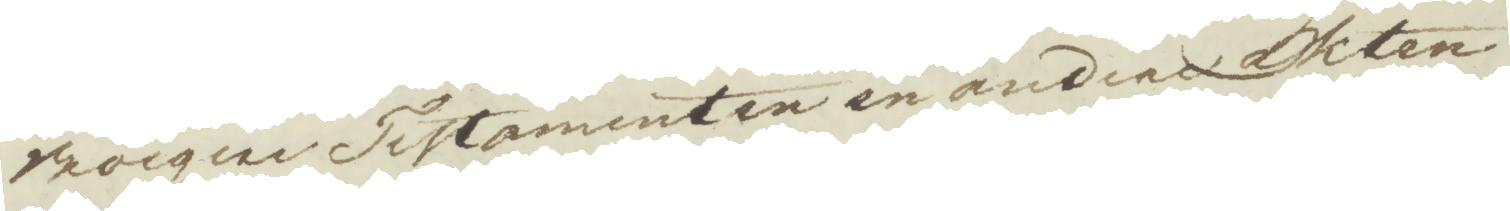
vroegere Testamenten en andere akten
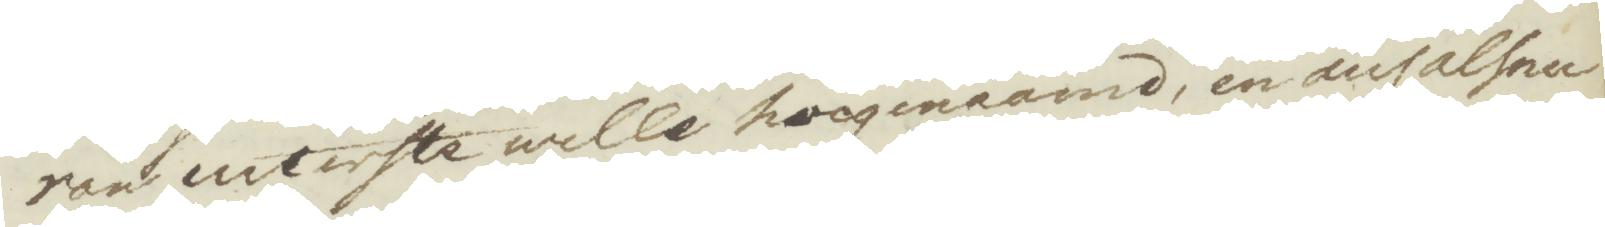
van uiterste wille hoegenaamd, en dus alsnu
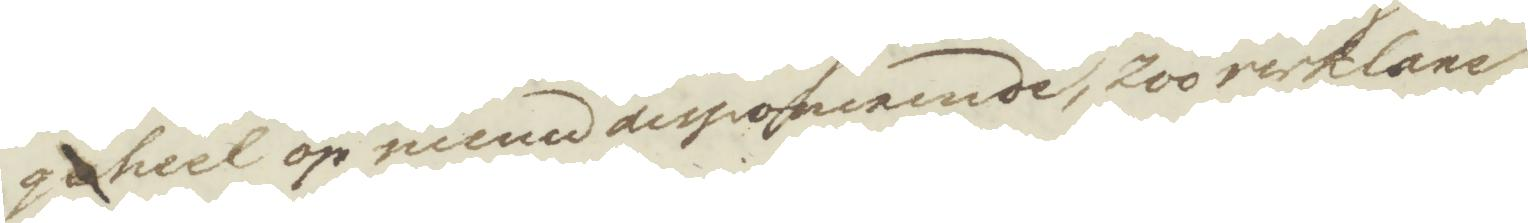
geheel op nieuw disponerende, zoo verklare
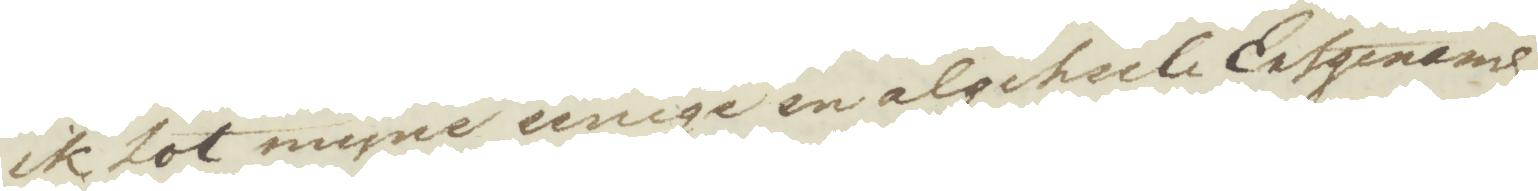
ik tot myne eenige en algeheele Erfgename
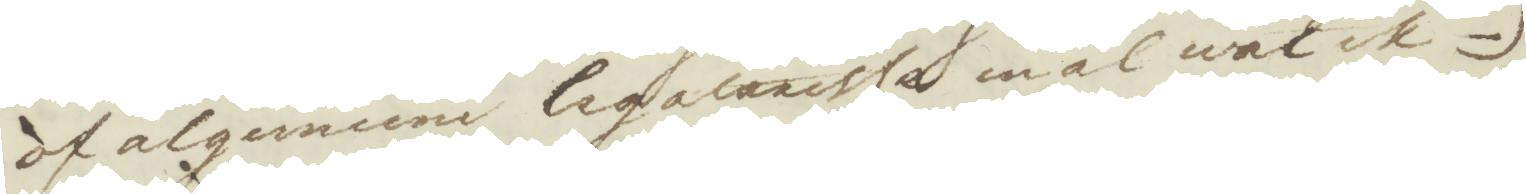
of algemeene legatarisse in al wat ik —
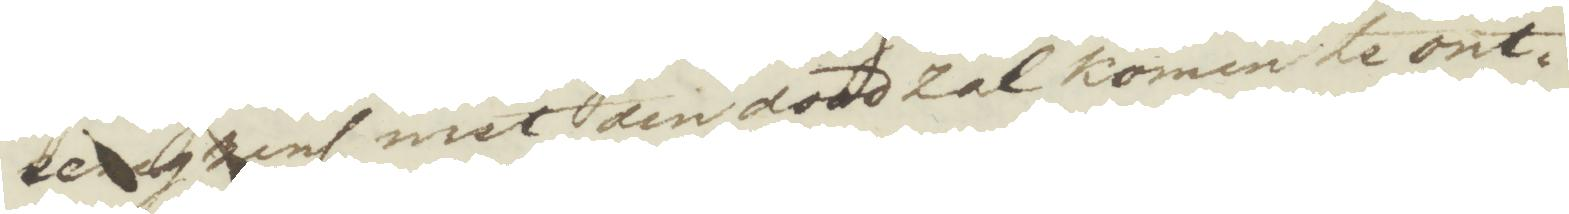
eenigzins met den dood zal komen te ont„
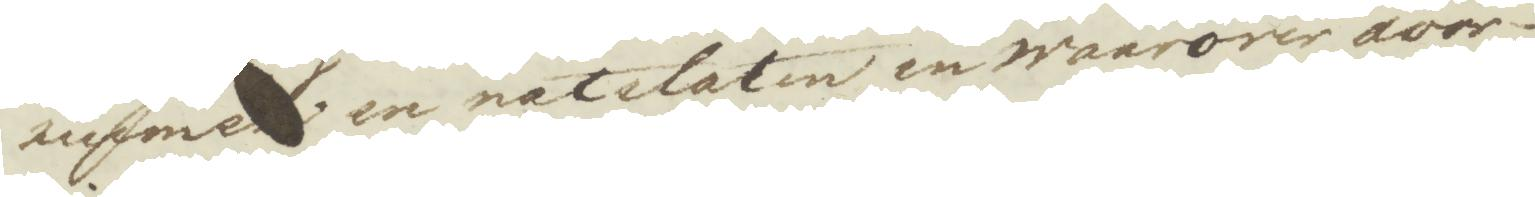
ruimen en natelaten en waarover door
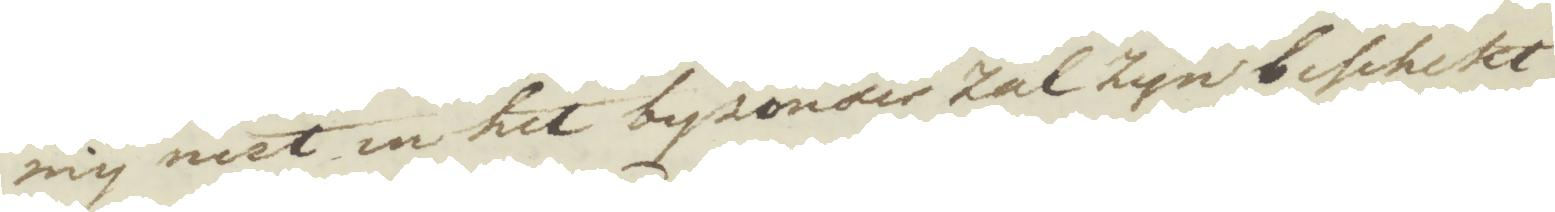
my niet in het bijzonder zal zyn beschikt
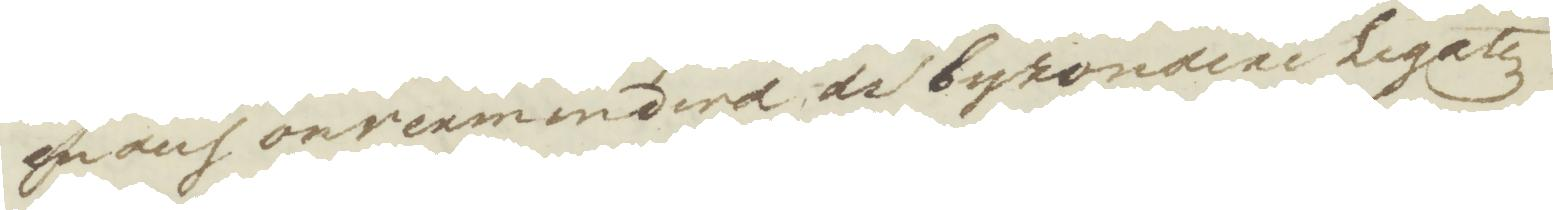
en dus onverminderd de byzondere legaten
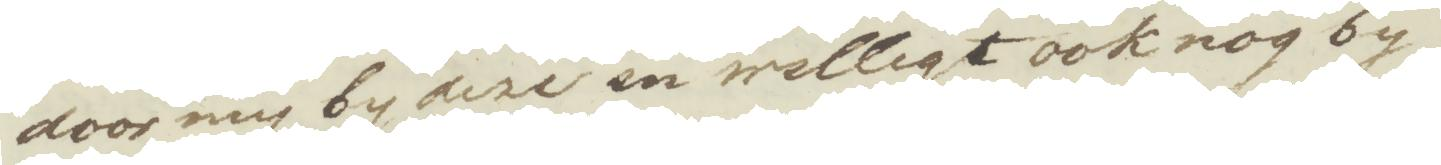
door mij bij deze en welligt ook nog by
